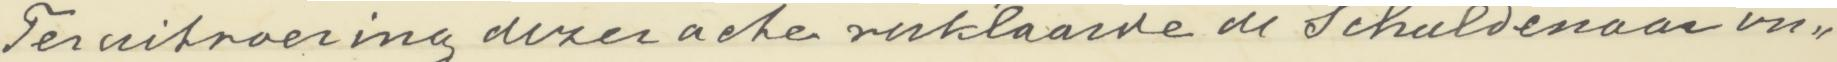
Ter uitvoering dezer acte verklaarde de schuldenaar on„
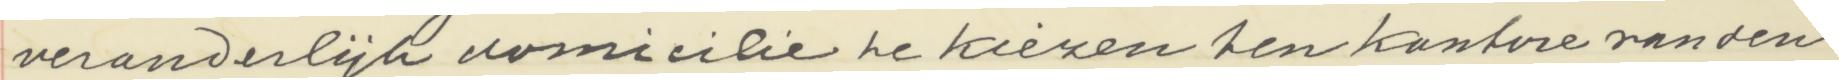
veranderlijk domicilie te kiezen ten kantore van den
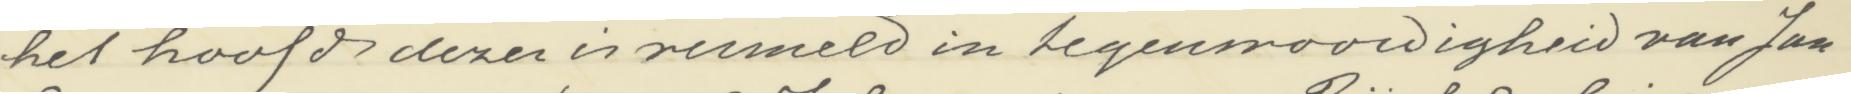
het hoofd dezer is vermeld in tegenwoordigheid van Jan
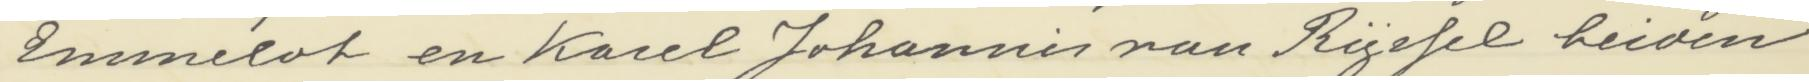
Emmelot en Karel Johannis van Rijssel beiden
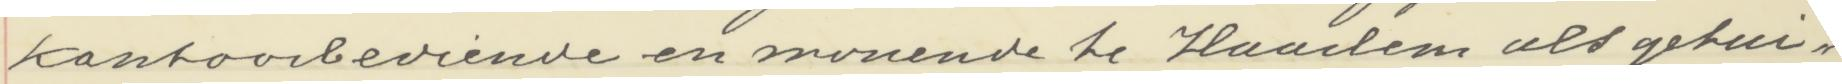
kantoorbediende en wonende te Haarlem als getui„
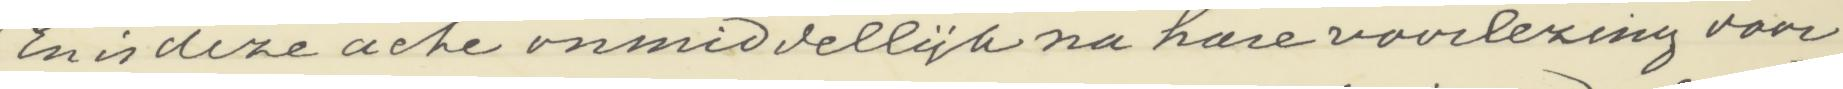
En is deze acte onmiddellijk na hare voorlezing voor
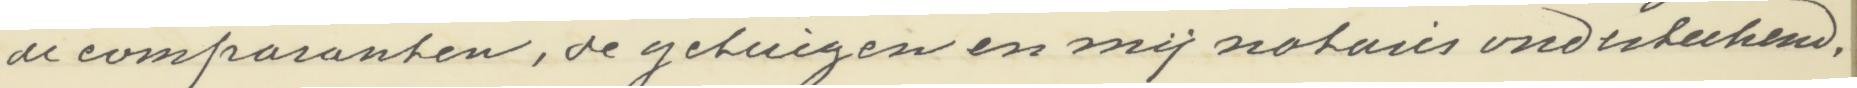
de comparanten, de getuigen en mij notaris onderteekend.
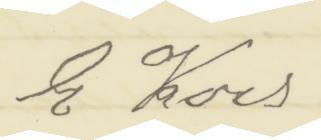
E Kors
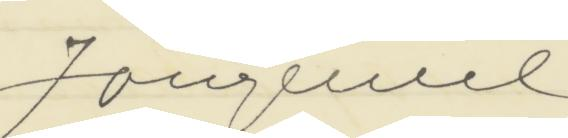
Jongeeel
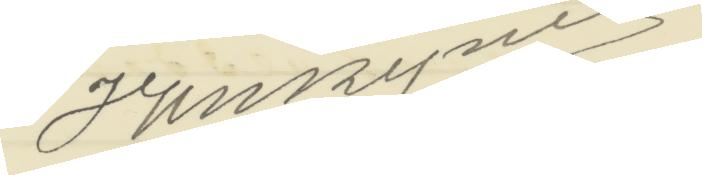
Ivanrijssel
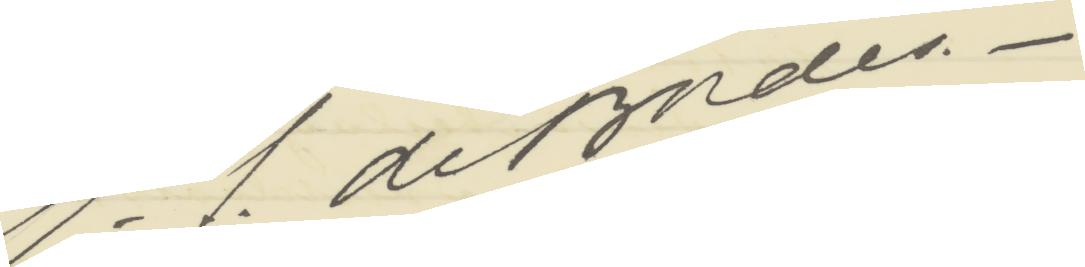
P.f. de Bordes.—
